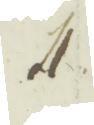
„ 4„
